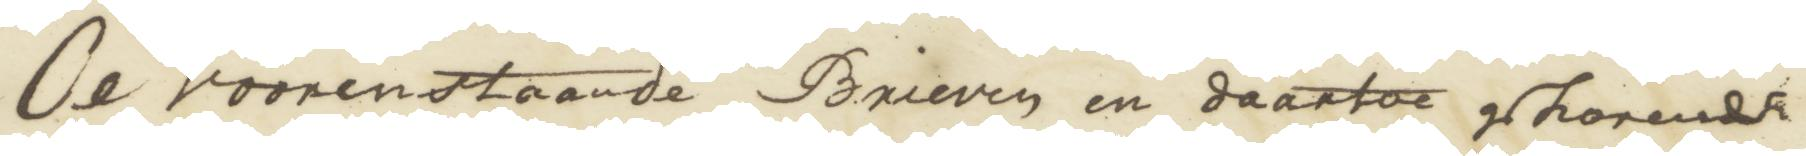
de voorenstaande Brieven en daartoe gehorende
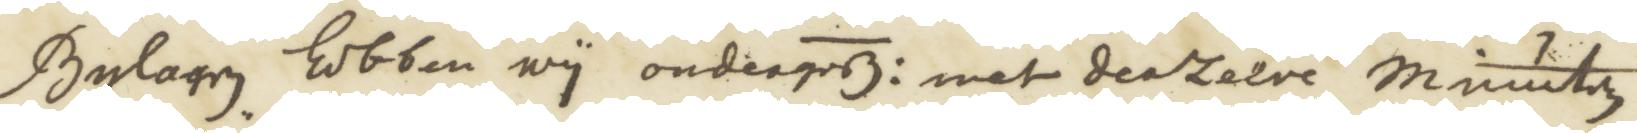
Bylagen hebben wij onderges: met derzelve minuten
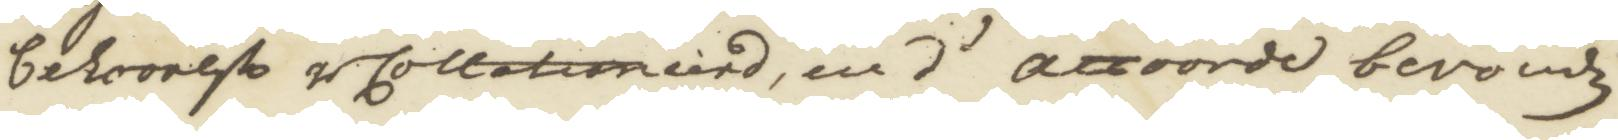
behoorlijk gecollationeerd, en d’ accoorde bevonden
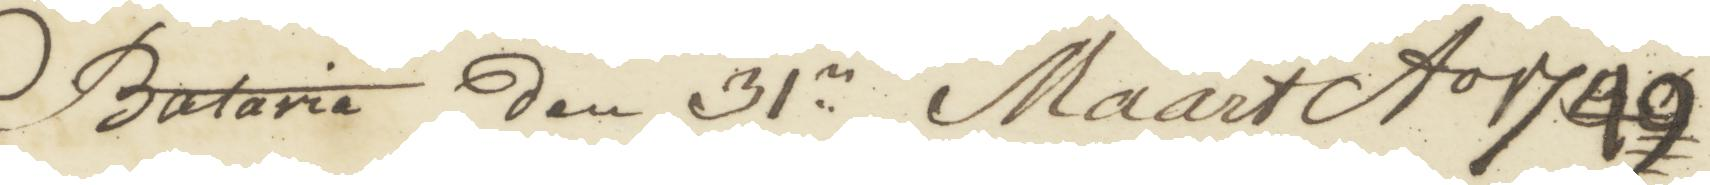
Batavia den 31:n Maart Ao 1749
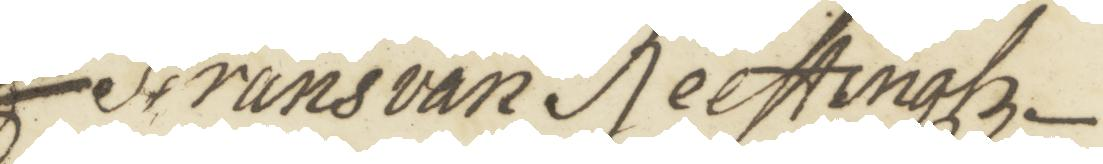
Frans van Keestingh.
